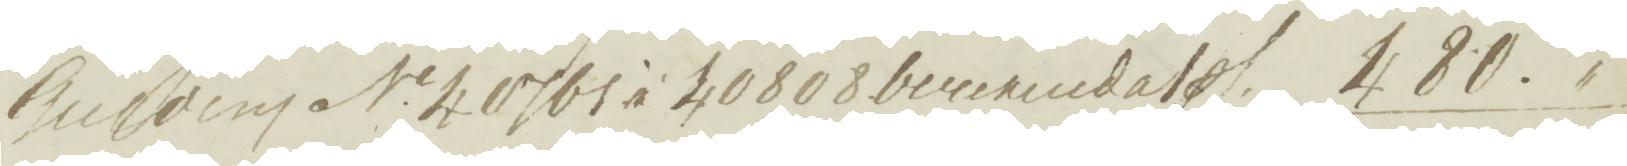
Guldens N.o 40765 á 40808. berekend 1pC. 480. „
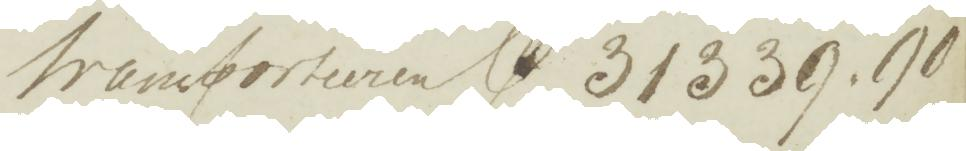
Transporteeren ƒ 31339.90
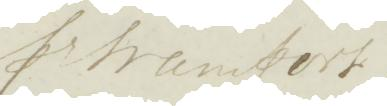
pr transport
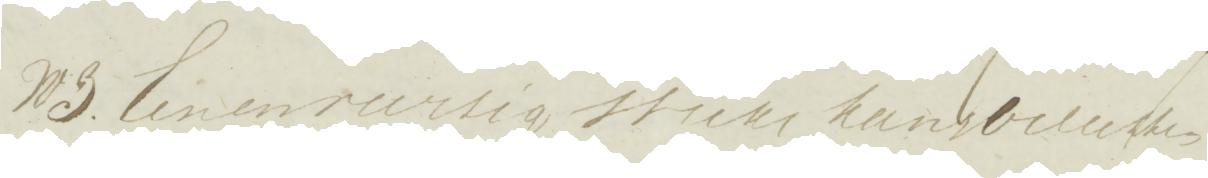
No 3. Eenenveertig stuks kansbelukke
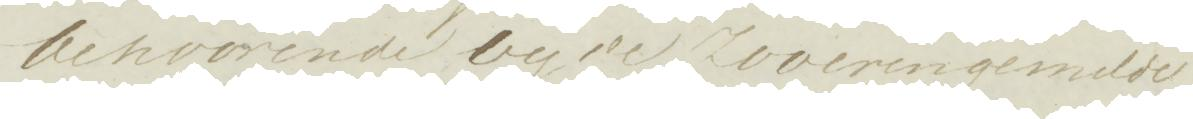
behoorende by de Zooevengemelde
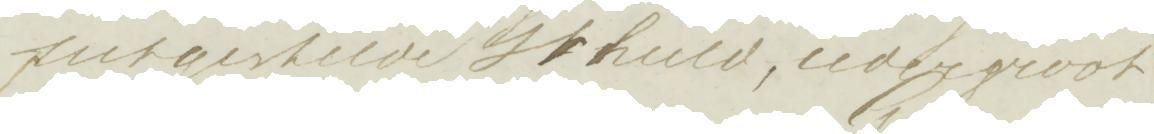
uitgestelde schuld, ieder groot
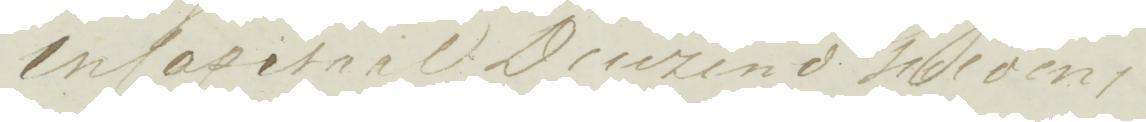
in Capitaal Duizend Gulden,
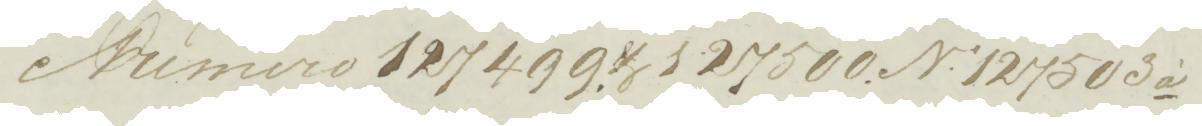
Numero 127499. & 127500. N.o 127503 á
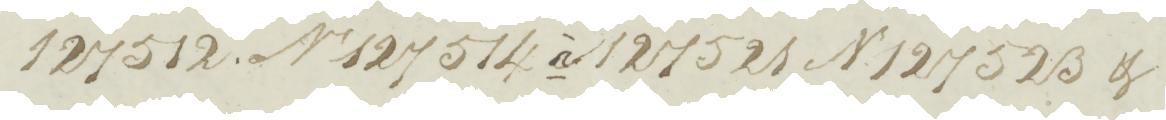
127512. No 127514 à 127521 N. 127523 &
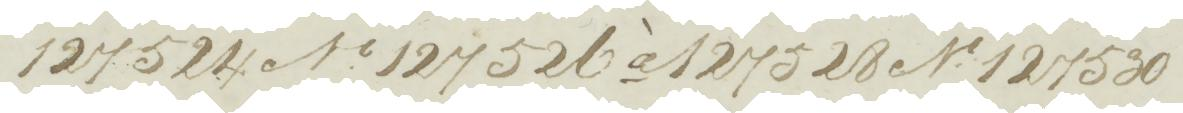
127524 N.o 127526 à 127528 N.o 127530
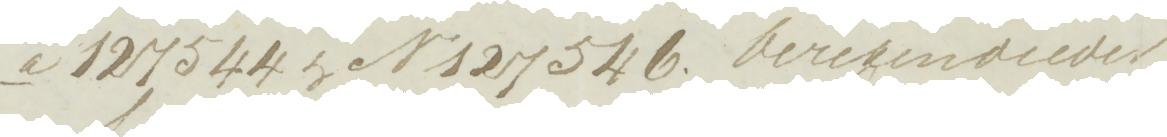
à 127544 en N 127546. berekend ieder
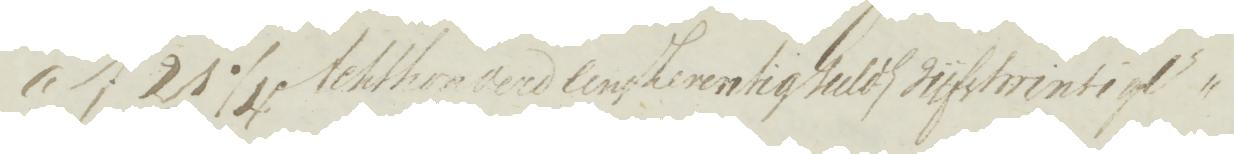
of 21 ¼ Achthonderd een en Zeventig Gulden vijfentwintig„
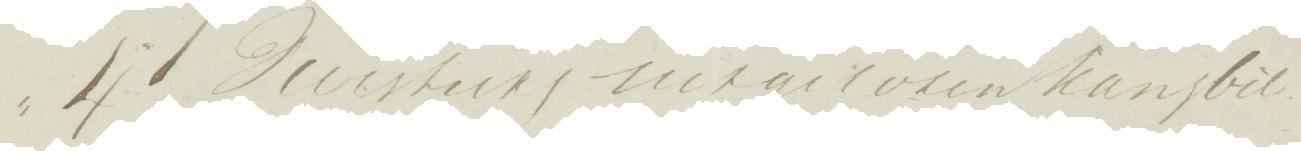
„ 4 Diversreec uitgeloten kansbil.
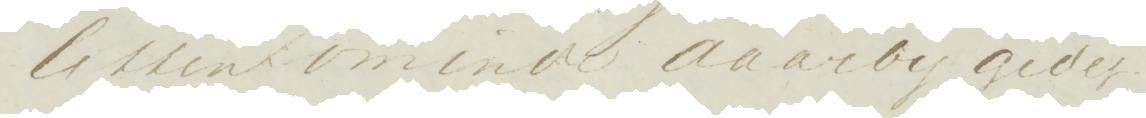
attent om in de daarby gedes
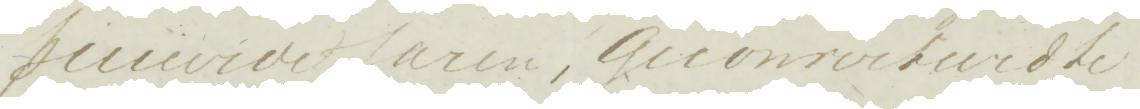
puieerde jaren, geconverteerd te
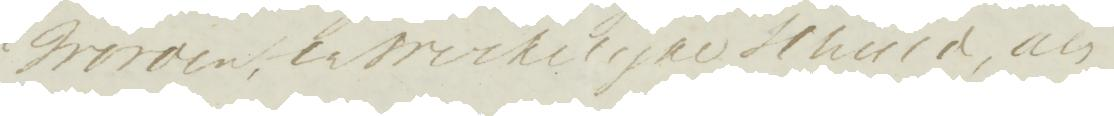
worden, en werkelyke schuld, als
